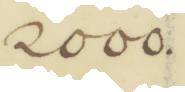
2000.
